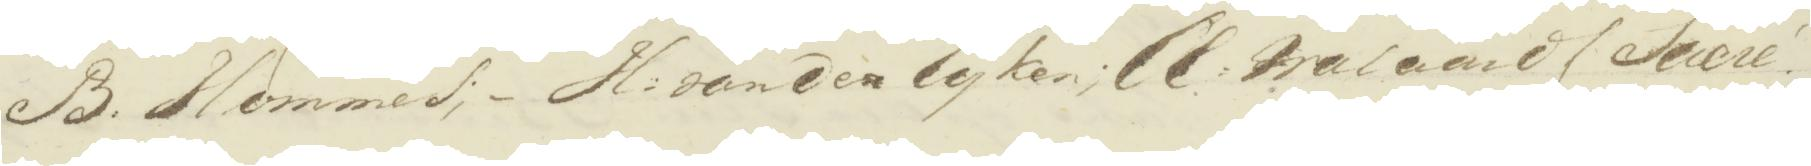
B. Hommes; - H: van der Eyken: Ae: Walaardt Sacré„
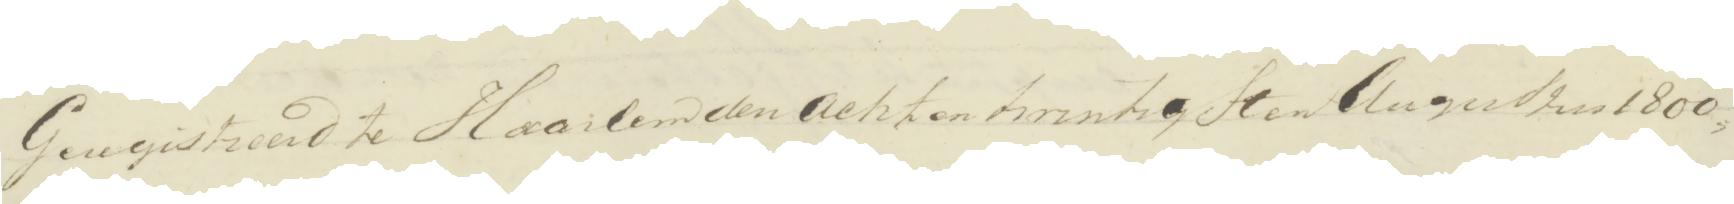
Geregistreerd te Haarlem den acht en twintigsten Augustus 1800,
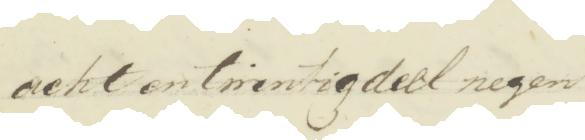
acht en twintig deel negen
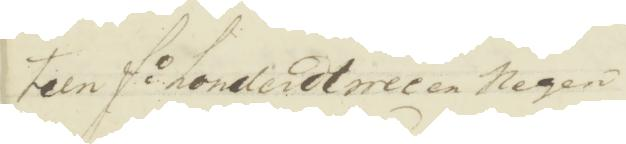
tien f:o honderd twee en negen
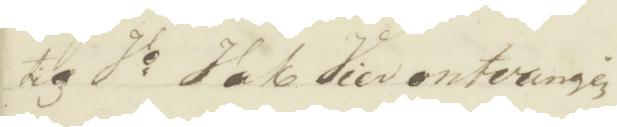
tig V:o Vak Vier ontvangen
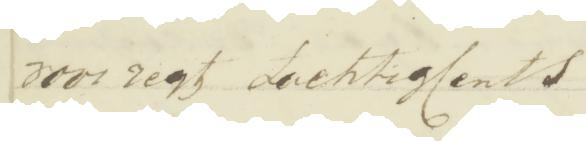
voor regt tachtig Cents
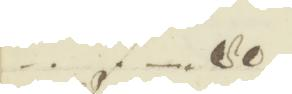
-- f —„ 80
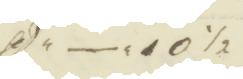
—„ 10½
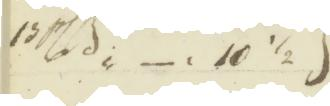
13 pCt„ —: 10½
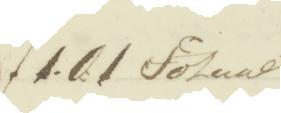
f 1.01 Totaal
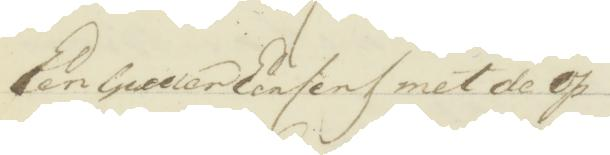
Een Gulden Een Cent met de op
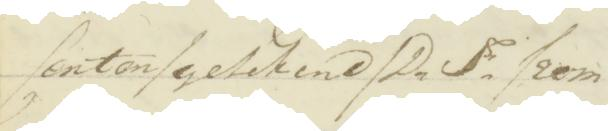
Centen / getekend D„ F. Crom
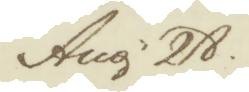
Aug 28.
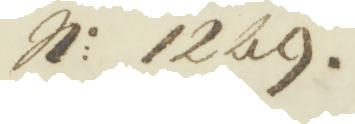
N:o 1249.
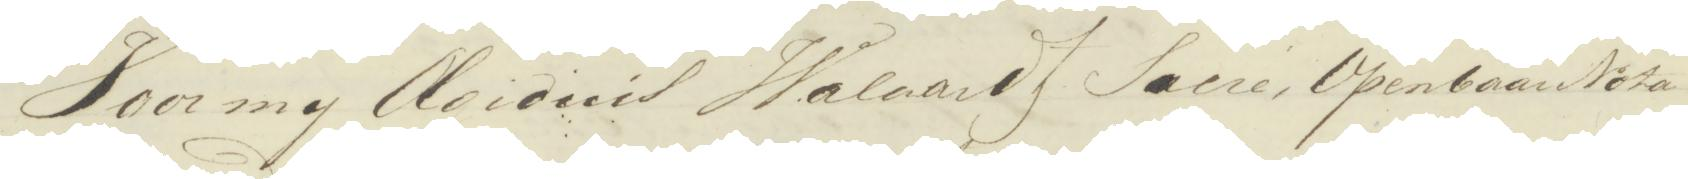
Voor my Aegiduis Walaardt Sacré, Openbaar Nota
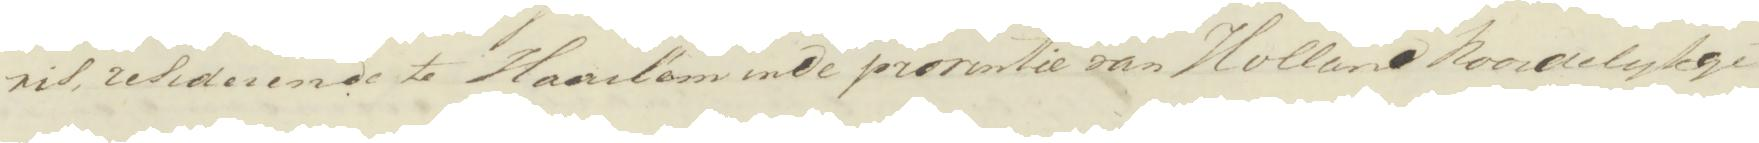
ris, residerende te Haarlem in de provintie van Holland Noordelyk ge
